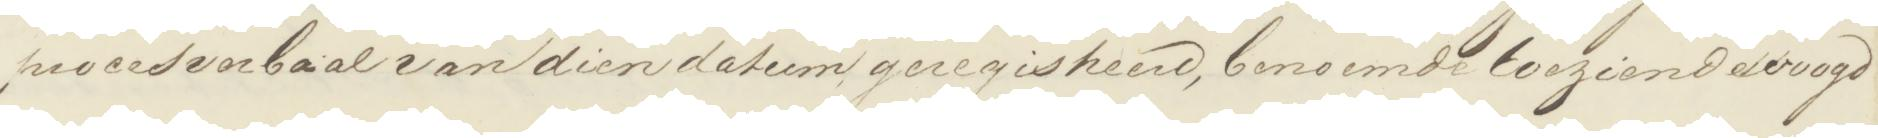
procesverbaal van dien datum geregistreerd, benoemde toeziende voogd
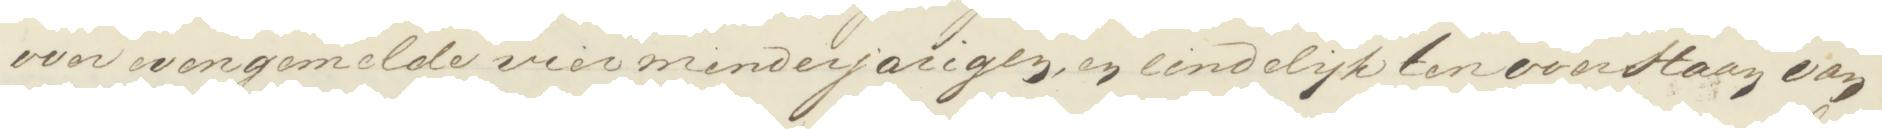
voor evengemelde vier minderjarigen, en eindelijk ten overstaan van
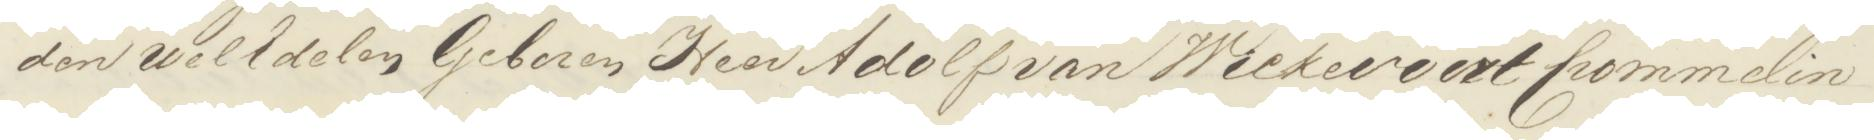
den wel Edelen Geboren Heer Adolf van Wiekevoort Crommelin
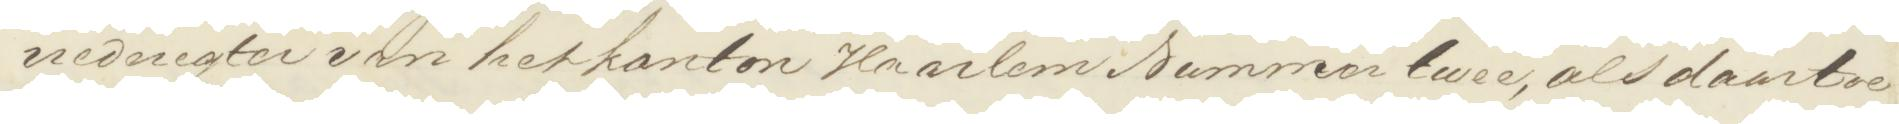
vrederegter van het kanton Haarlem Nummer twee, als daartoe
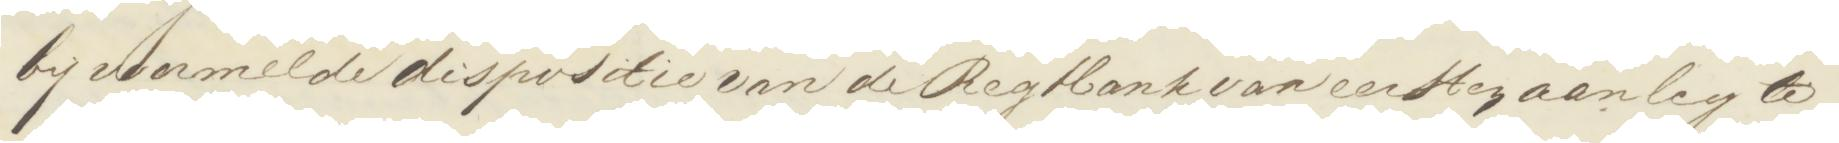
bij voormelde dispositie van de Regtbank van eersten aanleg te
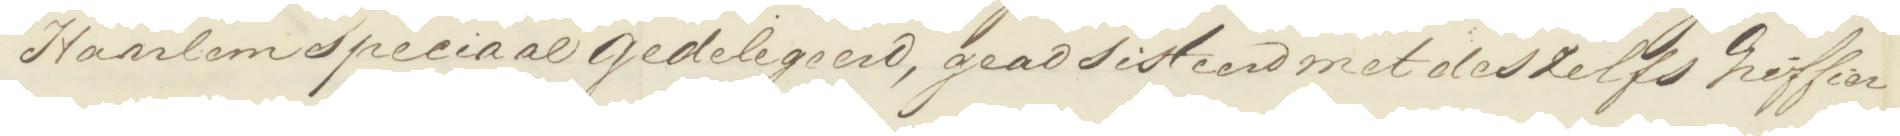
Haarlem speciaal gedelegeerd, geadsisteerd met deszelfs griffier
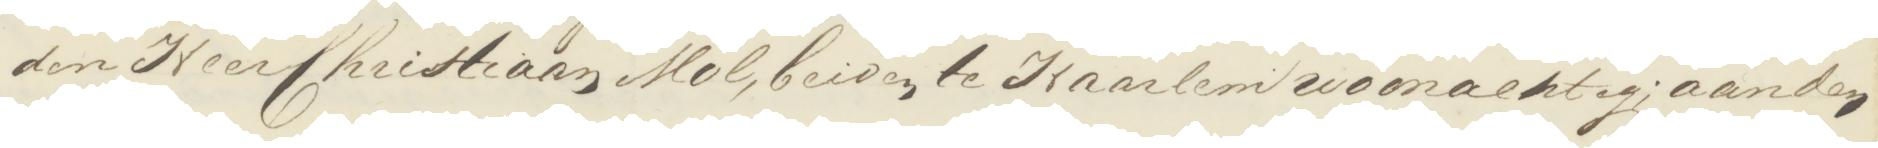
den Heer Christiaan Mol, beiden te Haarlem woonachtig; aan den
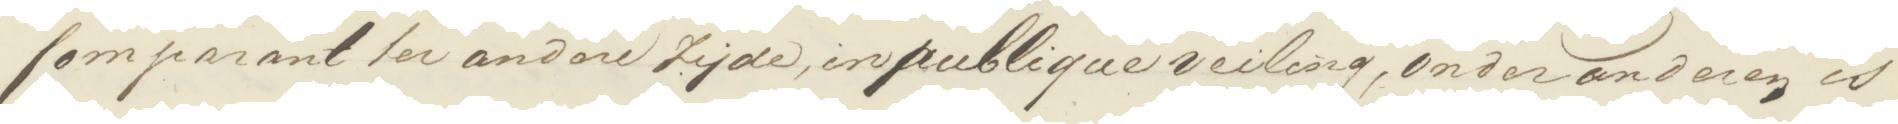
Comparant ter andere zijde, in publique veiling, onder anderen is
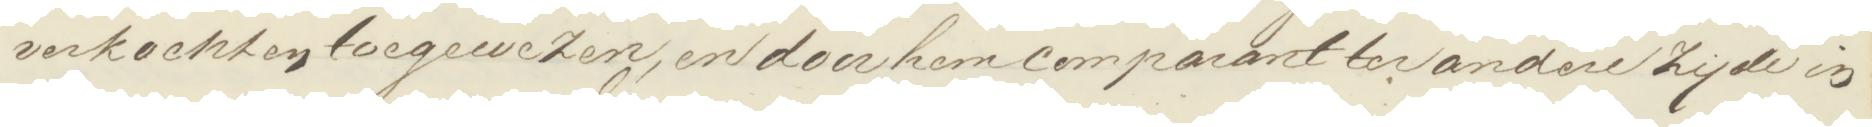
verkocht en toegewezen, en door hem comparant ter andere zijde in
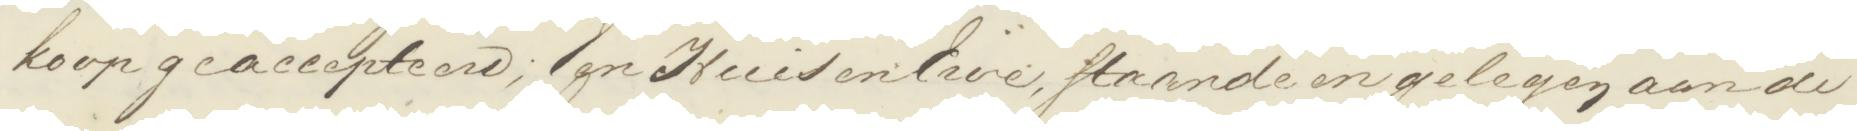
koop geaccepteerd; Een Huis en Erve, staande en gelegen aan de
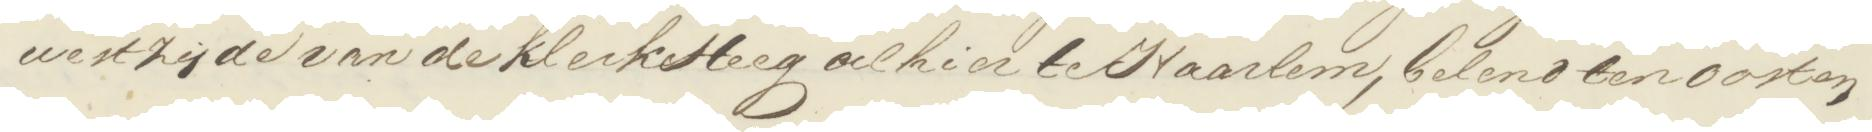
westzijde van de klerksteeg alhier te Haarlem, belend ten oosten
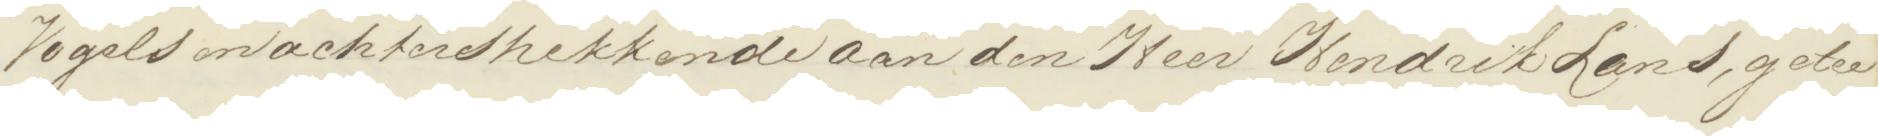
Vogels en achterstrekkende aan den Heer Hendrik Lans, getee
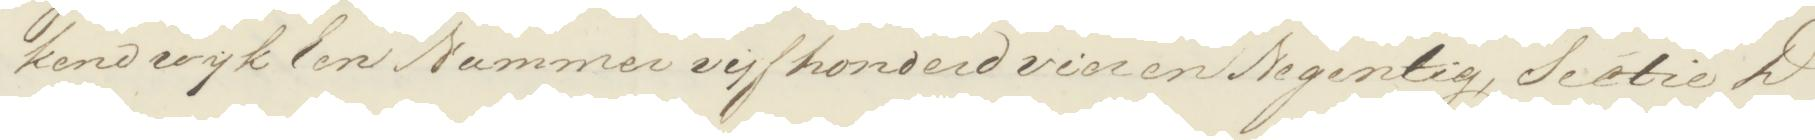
kend wijk Een Nummer vijf honderd vier en Negentig, Sectie D
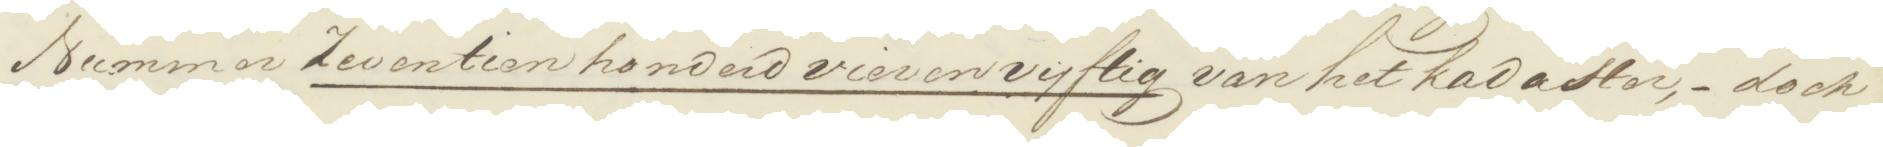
Nummer Zeventien honderd vier en vijftig van het kadaster, - doch
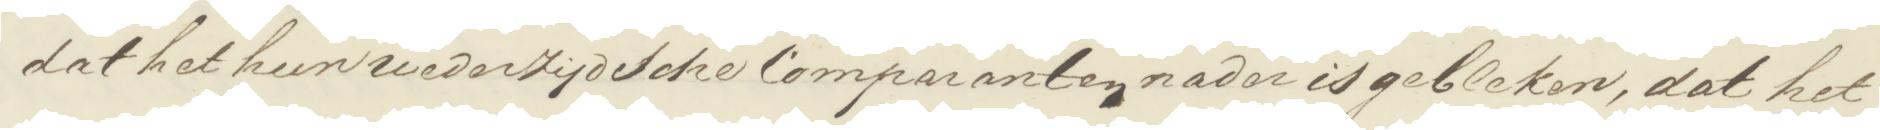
dat het hun wederzijdsche Comparanten nader is gebleken, dat het
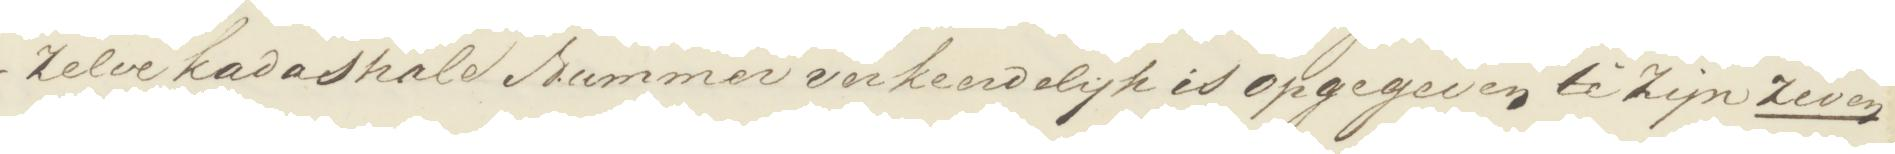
zelve kadastrale Nummer verkeerdelijk is opgegeven te zijn zeven
